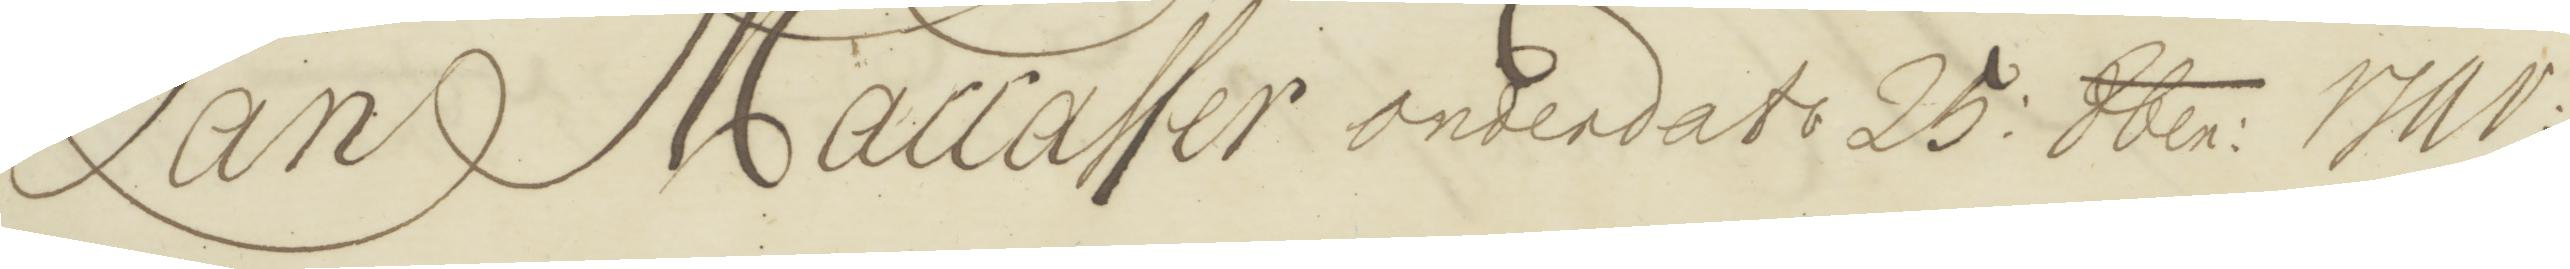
Van Maccasser onderdato 25: 8ber: 1741:
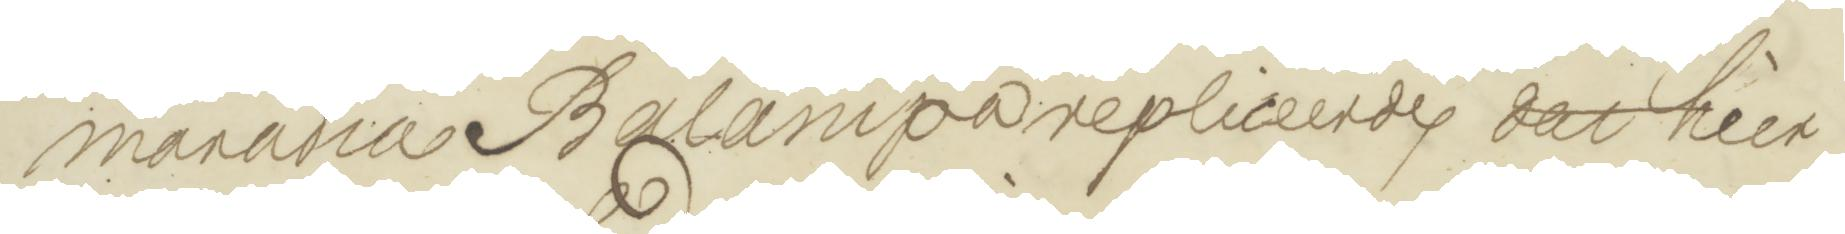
maradia Balanipa repliceerde dat hier
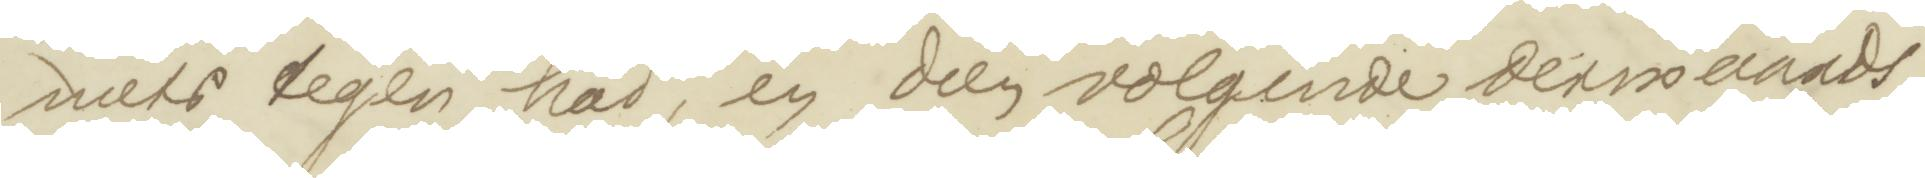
niets tegen had, en dien volgende derwaards
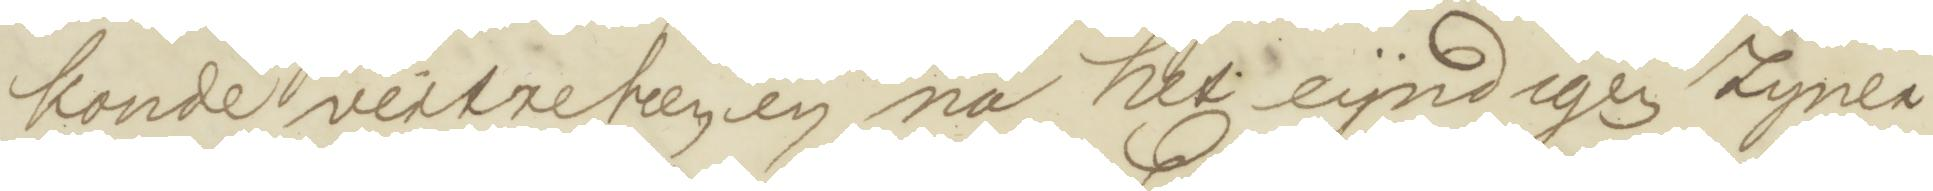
konde vertreken en na het eijndigen zijner
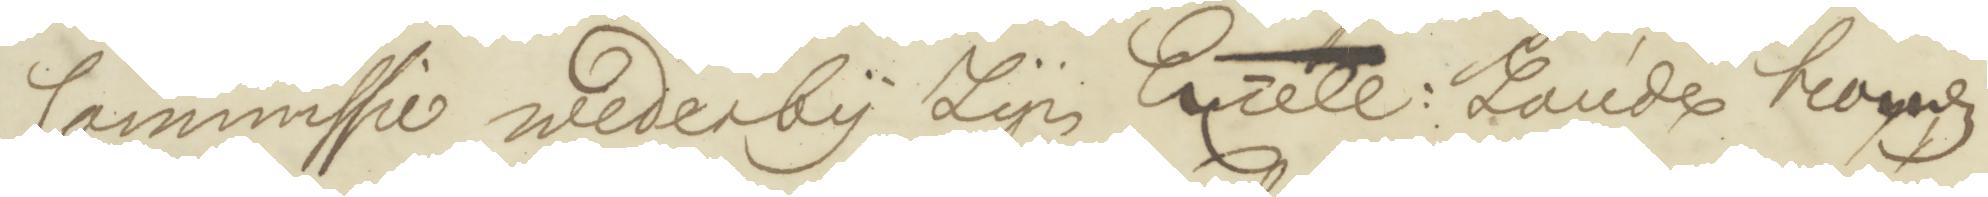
Commissie wederbij zijn Excell: zoude komen
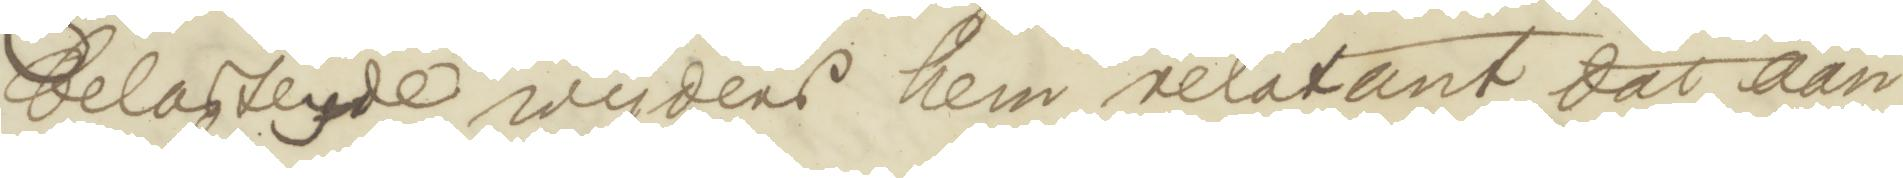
belasteijde wijders hem relatant dat aan
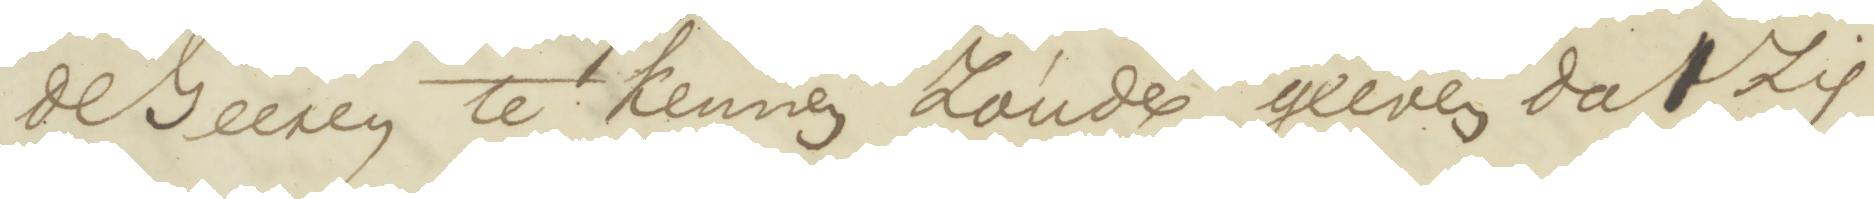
de heeren te kennen zoude geeven dat zij
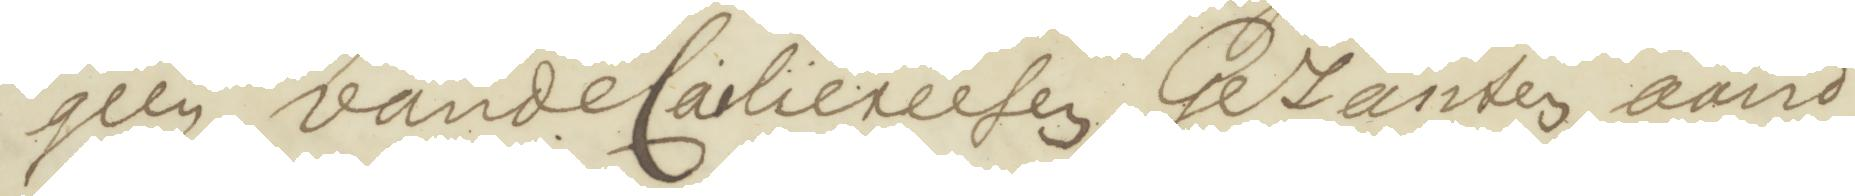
geen vande Cailiereesen Gezanten aand
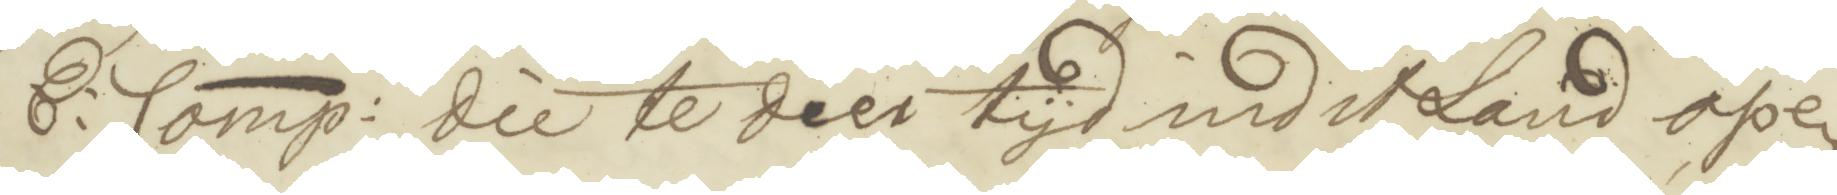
E: Comp: die te dier tijd indit land open
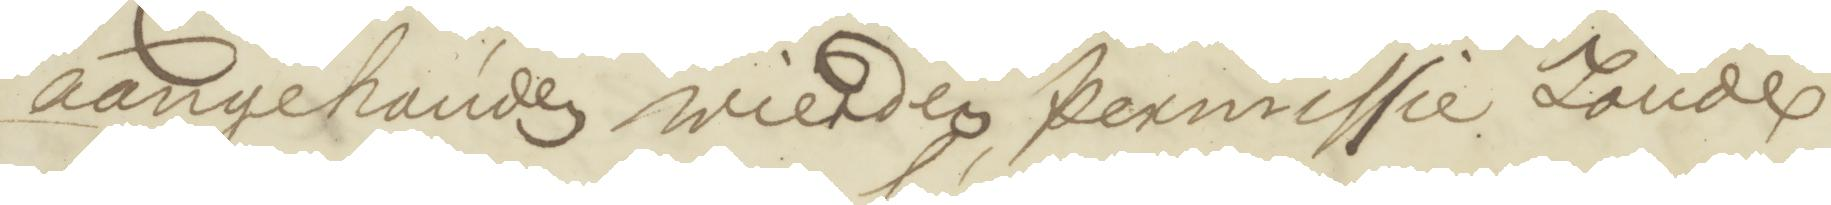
aangehouden wierden permissie zoude
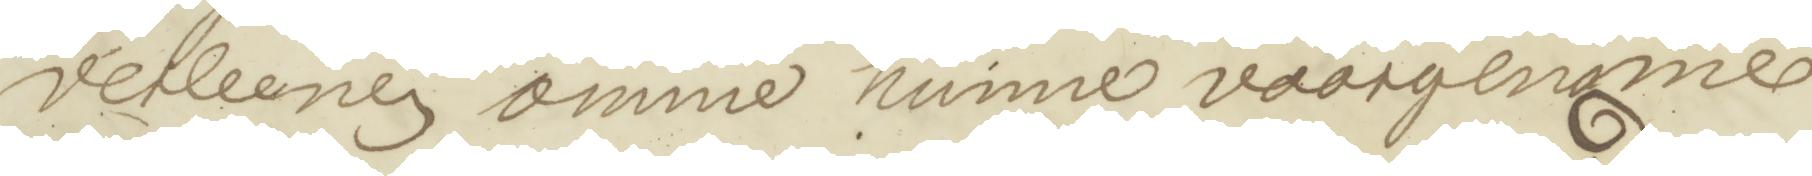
verleenen omme hunne voorgenome
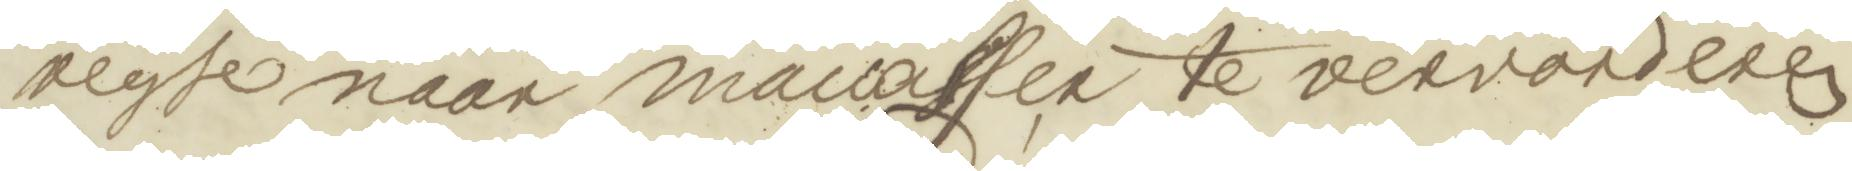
reijse naar maccasser te vervorderen
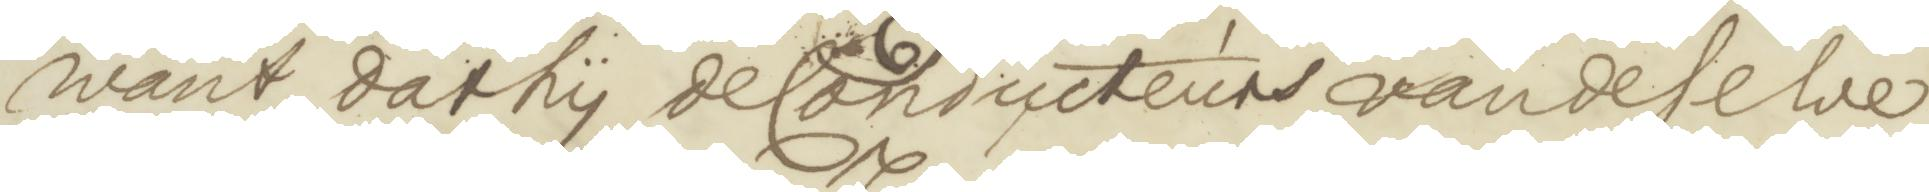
want dat hij de Conducteurs van deselve
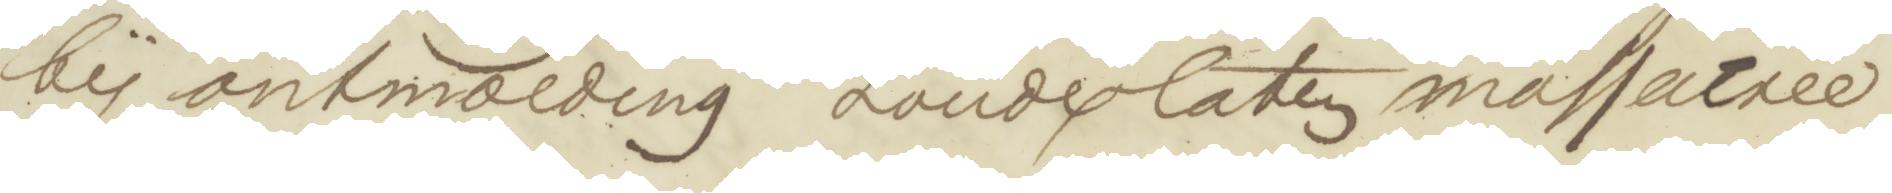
bij ontmoeding zoude laten massacree
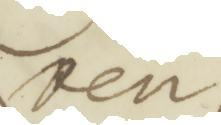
ren,
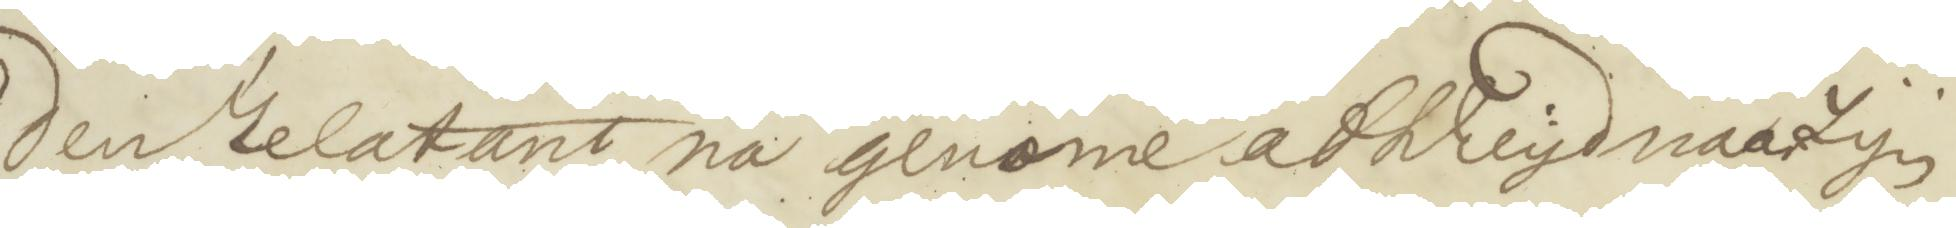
den relatant na genome afscheijd naarzijn
